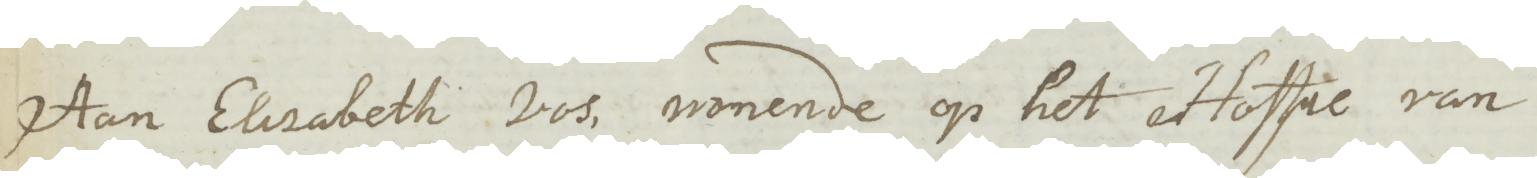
Aan Elisabeth Vos, wonende op het Hoffie van
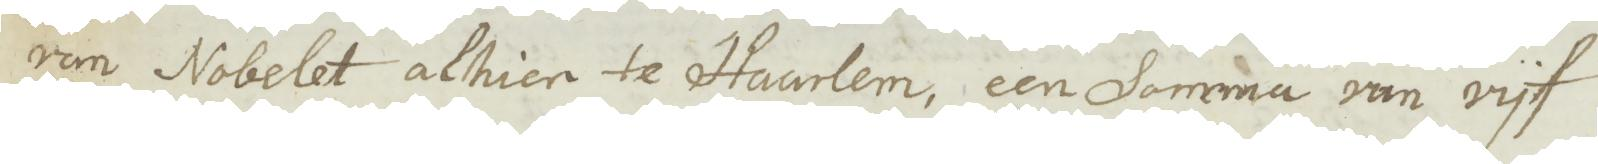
van Nobelet alhier te Haarlem, een somma van vijf
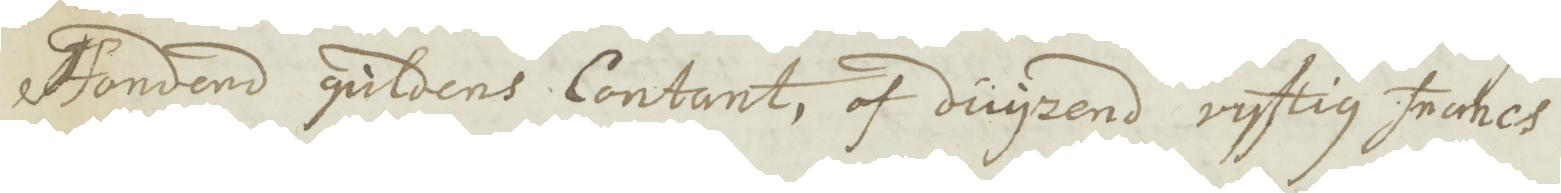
Honderd guldens Contant, of duijzend vyftig francsr
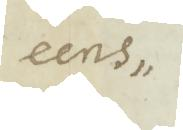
eens„
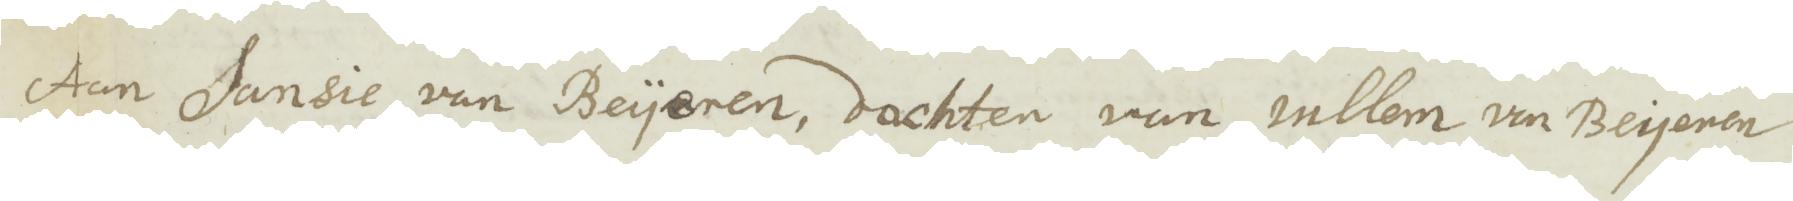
Aan Jansie van Beijeren, dochter van wllem van Beijeren
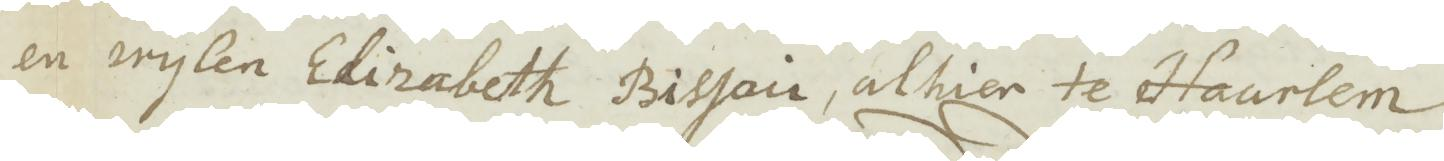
en wylen Elizabeth Bisjau, alhier te Haarlem
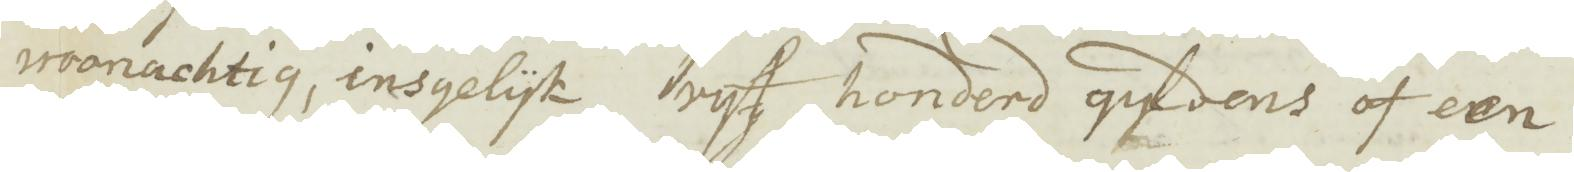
woonachtig, insgelijk vyf honderd guldens of een
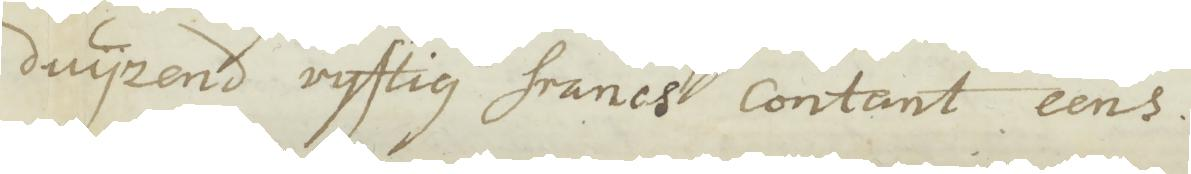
duijzend vyftig francs contant eens.
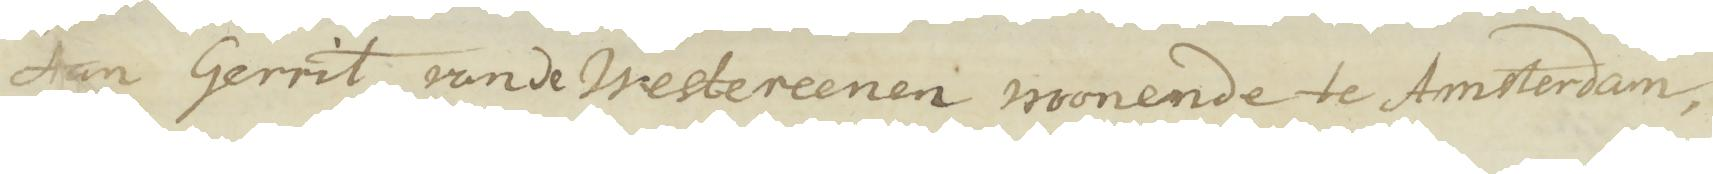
Aan Gerrit van de Westereenen woonende te Amsterdam,
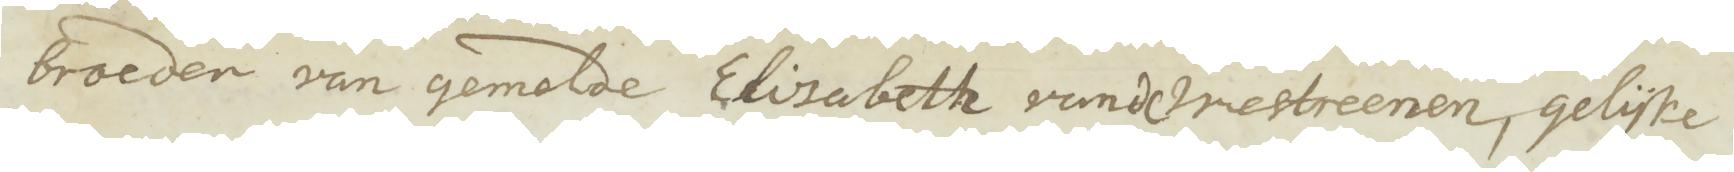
broeder van gemelde Elizabeth van de Westreenen, gelijke
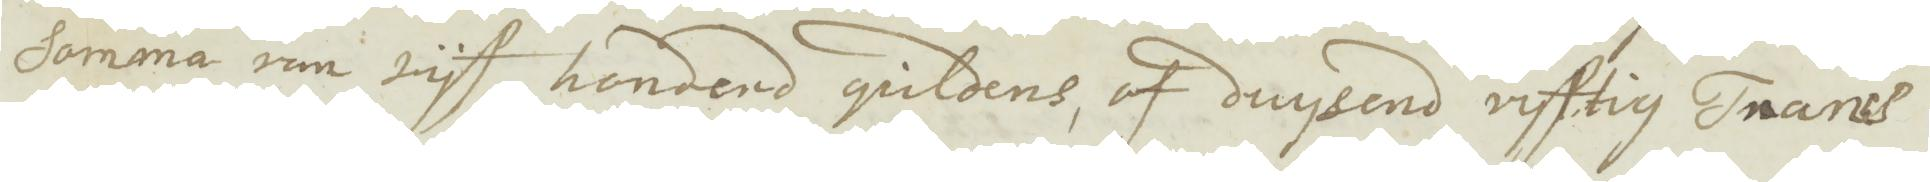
somma van vijf honderd guldens, of duysend vyftig Francs
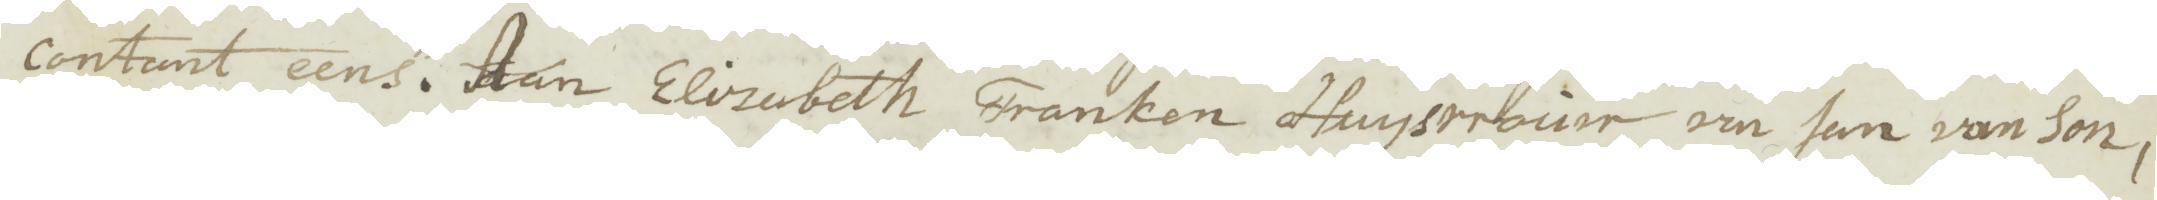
contant eens. Aan Elizabeth Franken Huysvrouw van Jan van Son,
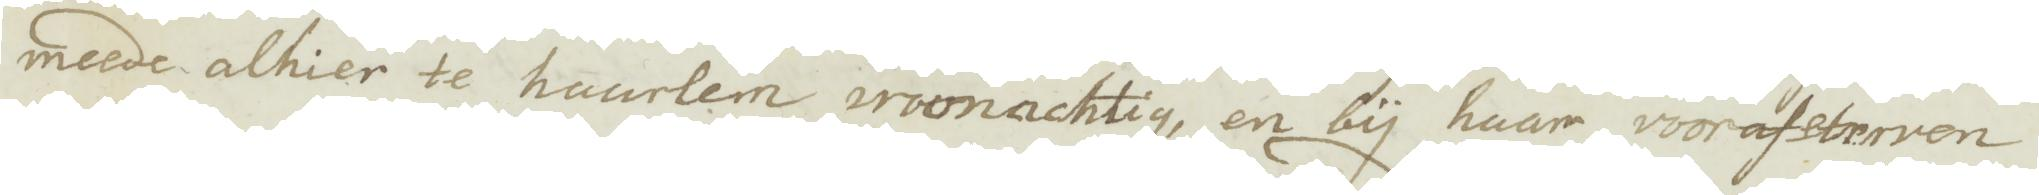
meede alhier te haarlem woonachtig, en bij haar voorafsterven
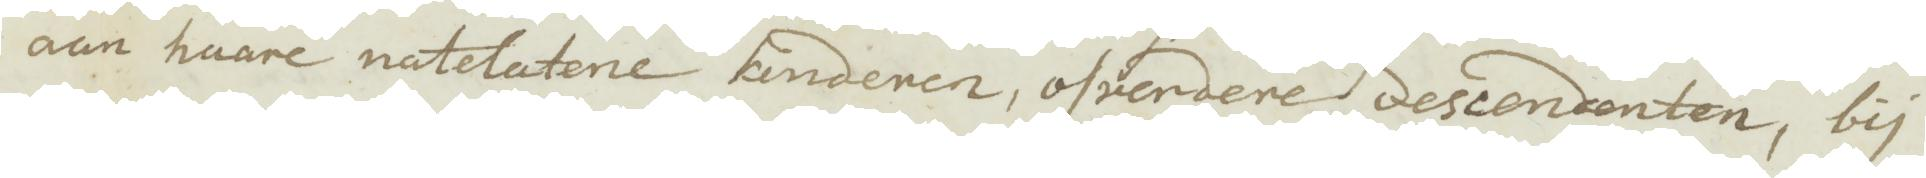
aan haare natelatene kinderen, of verdere descendenten, bij
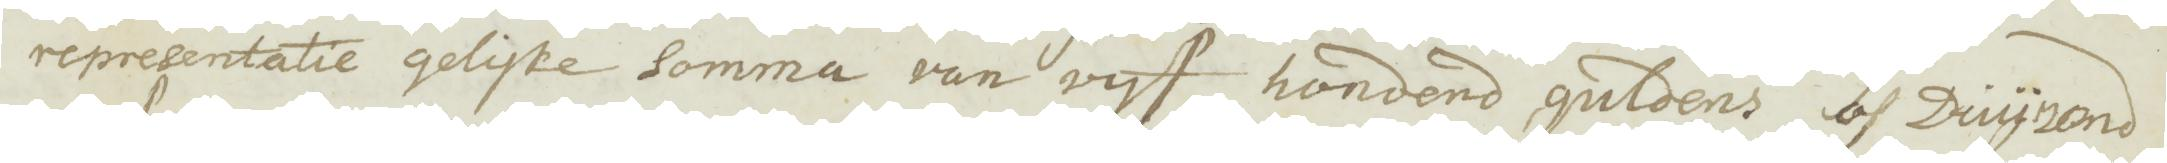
representatie gelijke somma van vyf honderd guldens of Duijzend
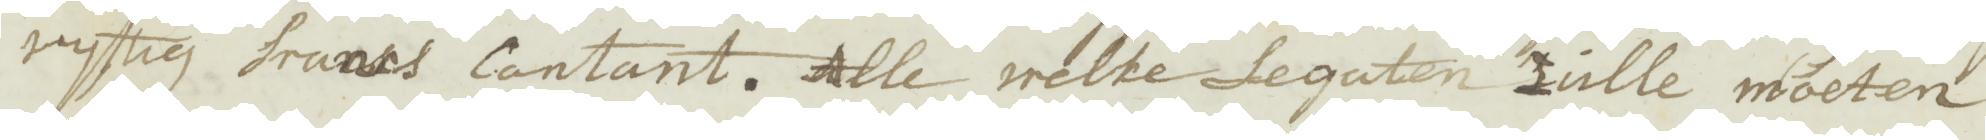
vyftig francs Contant. Alle welke Legaten zulle moeten
